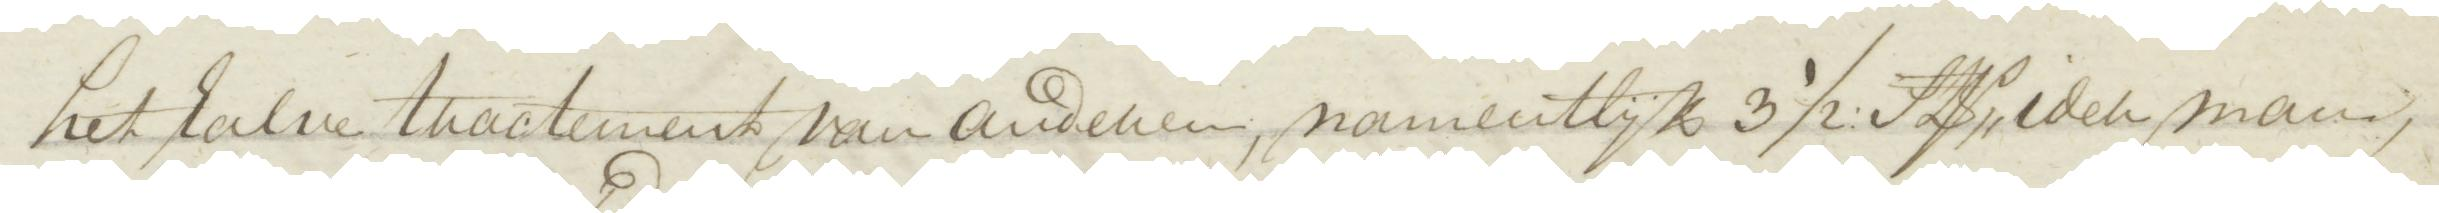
het halve tractement van anderen, namentlijk 3½: stver„s ider man,
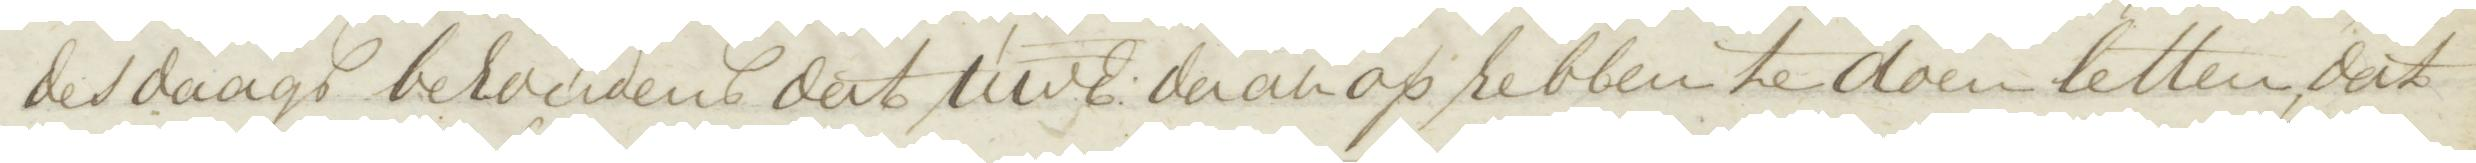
desdaags behoudens dat uwE: daar op hebben te doen letten, dat
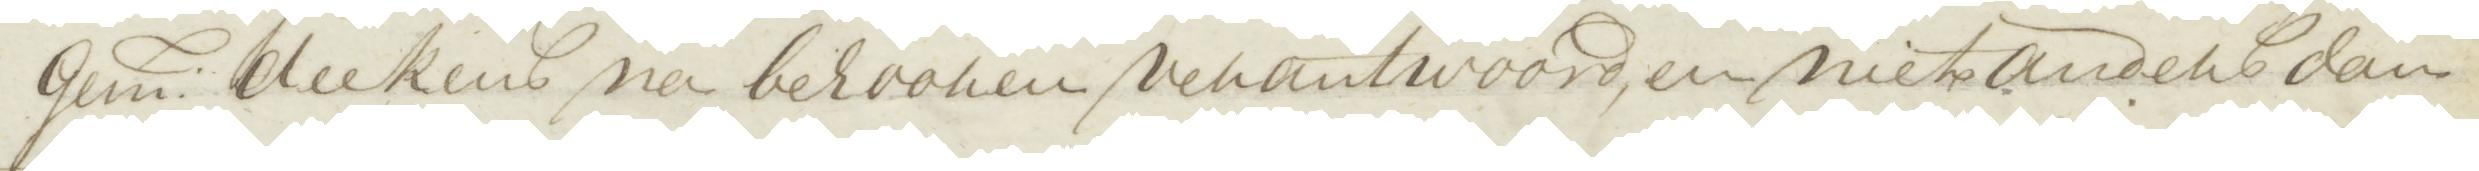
gem: deekens na behooren verantwoord, en niet anders dan
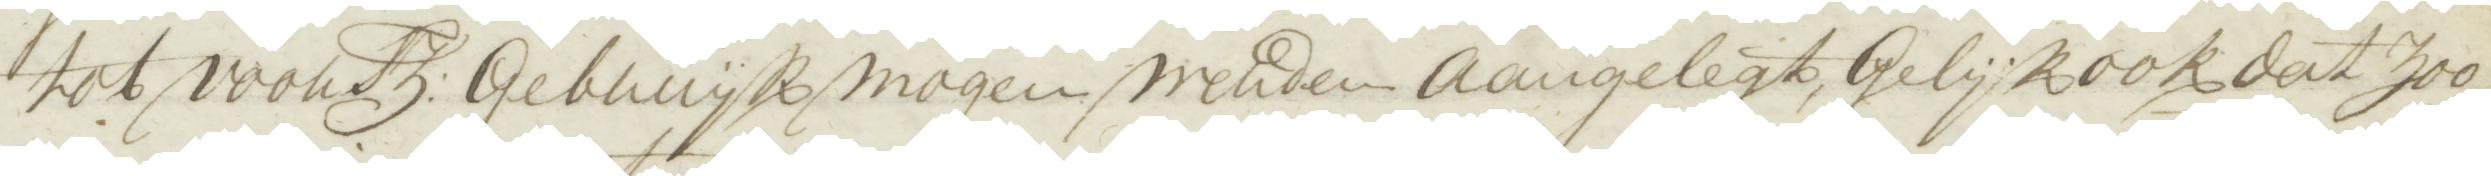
tot voorsz: gebruijk mogen werden aangelegt, gelijk ook dat zoo
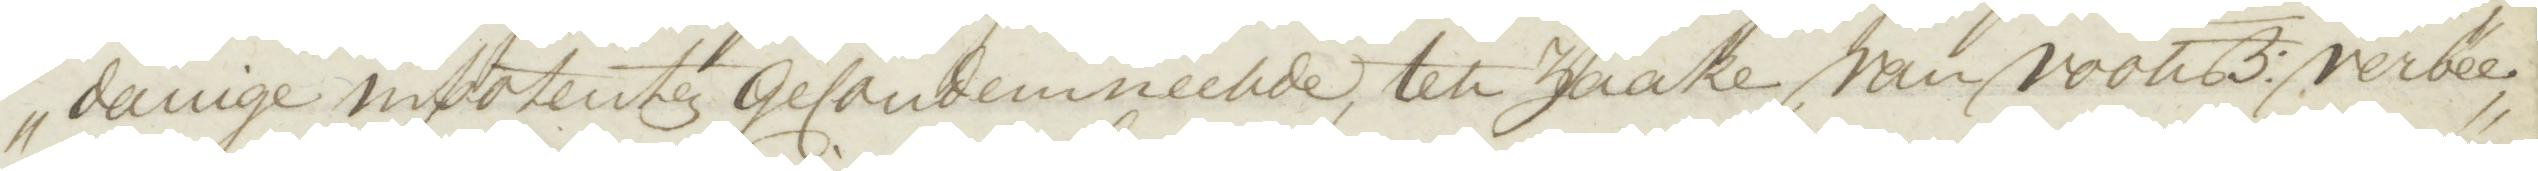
„danige inpotenten gecondemneerde, ter zaake van voorsz: verbee„
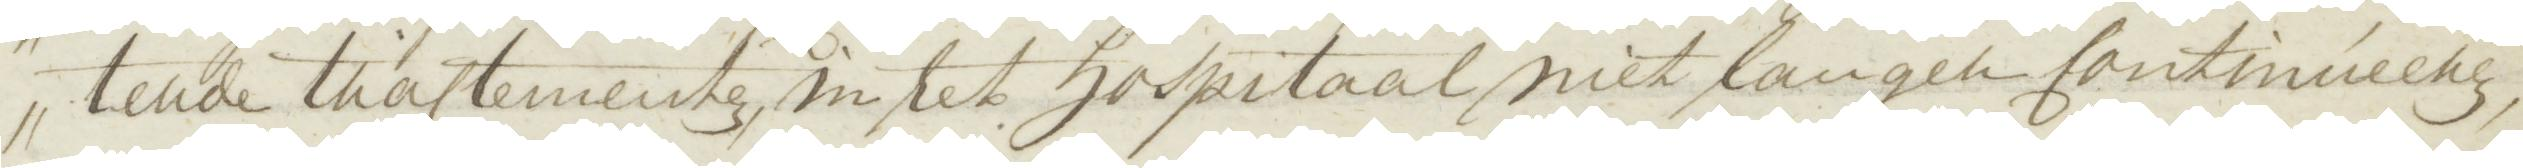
„terde tractementen, in het Hospitaal niet langer Continueeren,
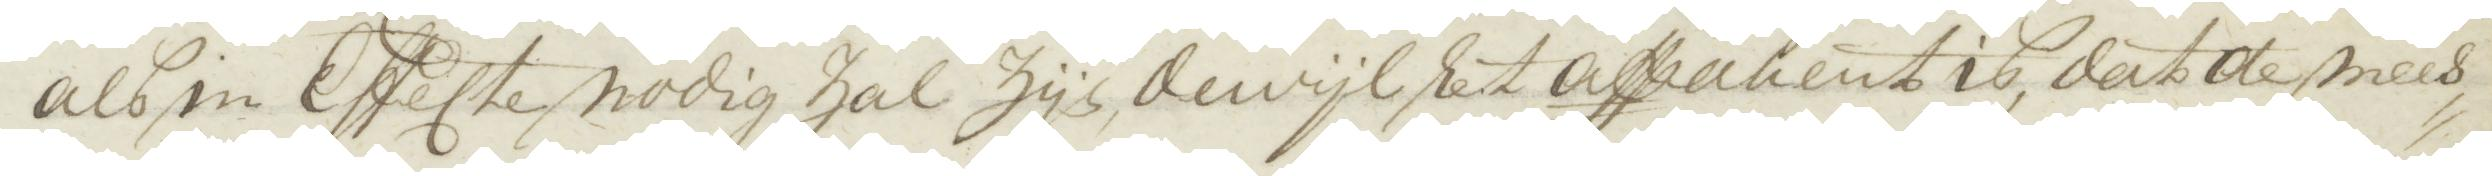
als in Effecte nodig zal zijn, dewijl het apparent is, dat de mees„
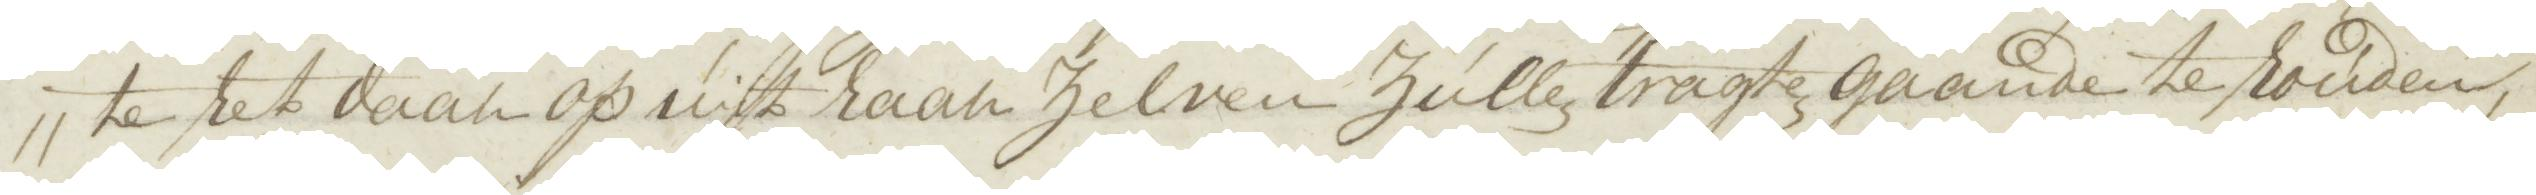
„te het daar op uijt haar zelven zullen tragten gaande te houden,
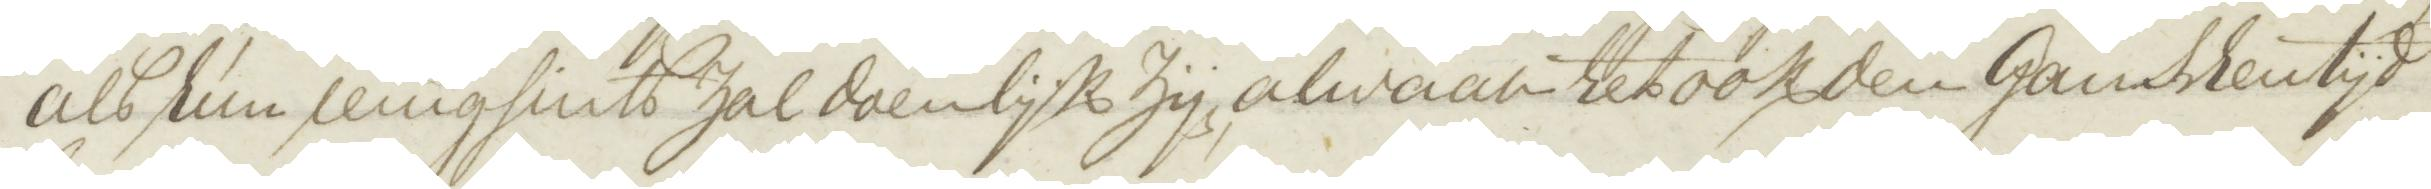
als hun eenigsints zal doenlijk zijn, alwaar het ook den ganschentijd
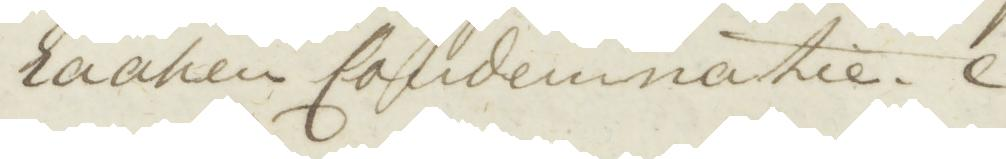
haaren Condemnatie—
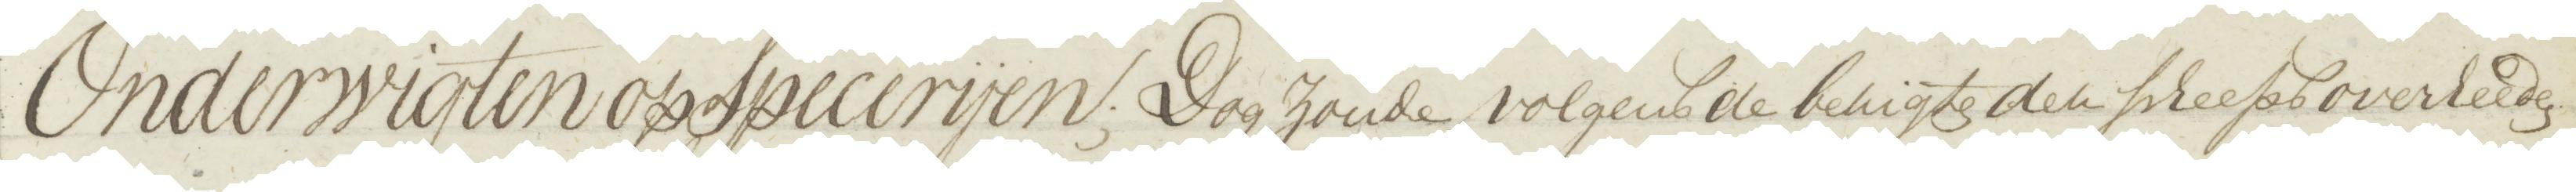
Onderwigten op specerijen; Dog zoude volgens de berigten der scheeps overheeden
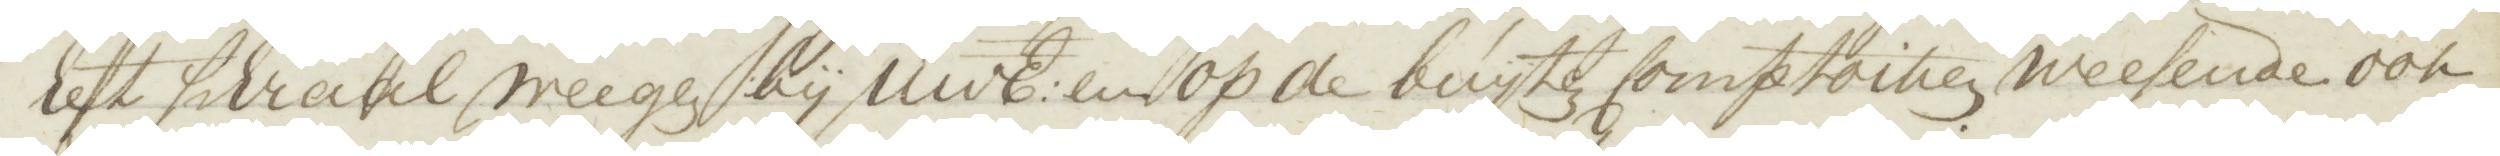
het schraal weegen bij uwE: en op de buijten Comptoiren weesende oor
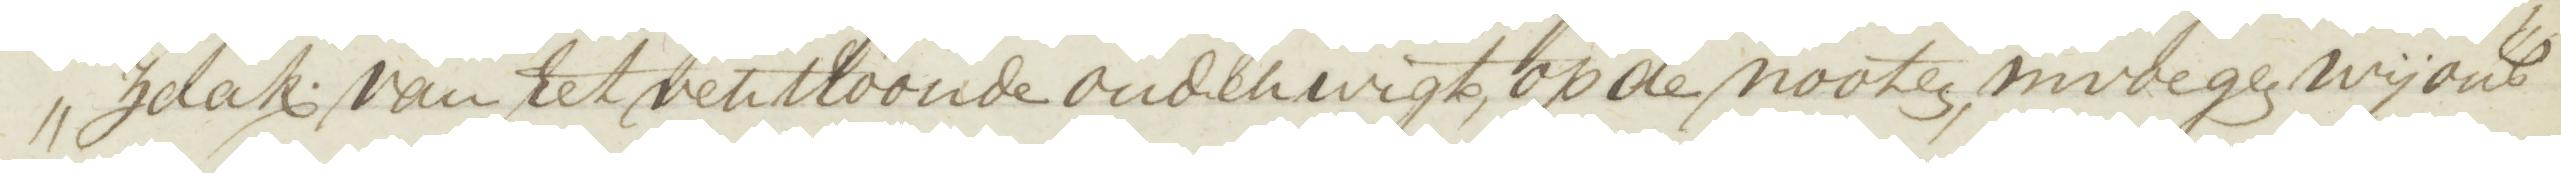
„zaak van het verthoonde onderwigt, op de nooten, invoegen wij ons
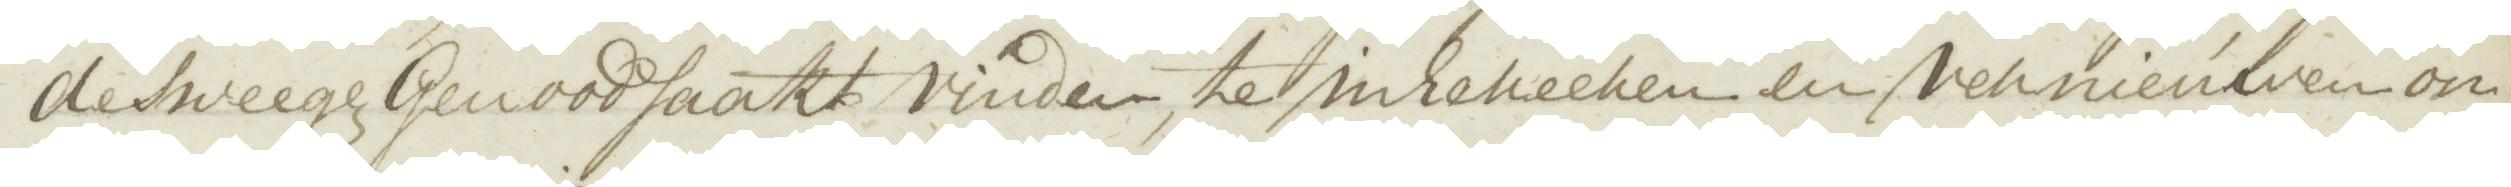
desweegen genoodsaakt vinden, te inhereeren en vernieuwen on
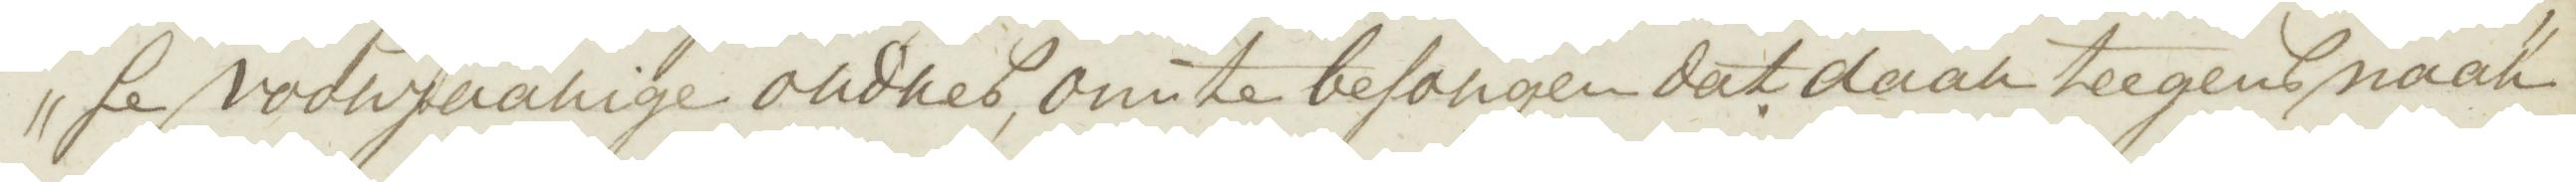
„se voorjaarige ordres, om te besorgen dat daar teegens naar
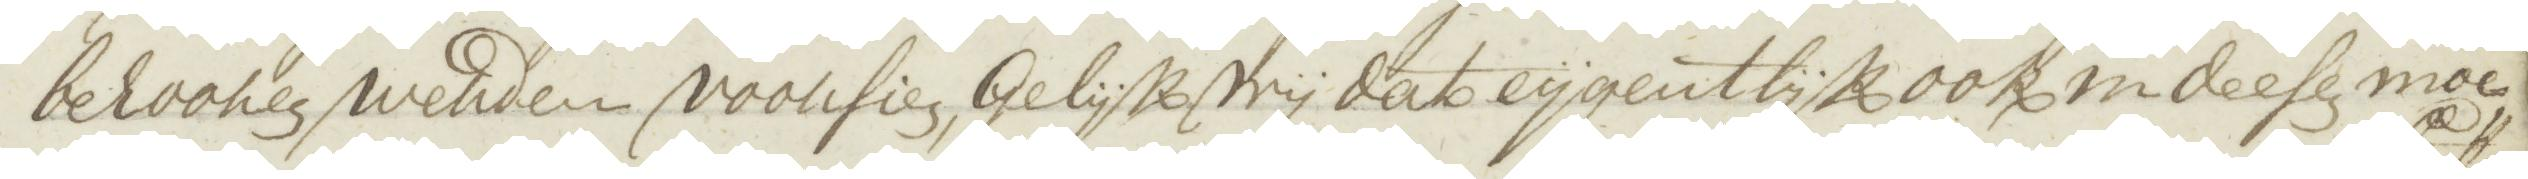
behooren werden voorsien, gelijk wij dat eijgentlijk ook in deesen moe„
